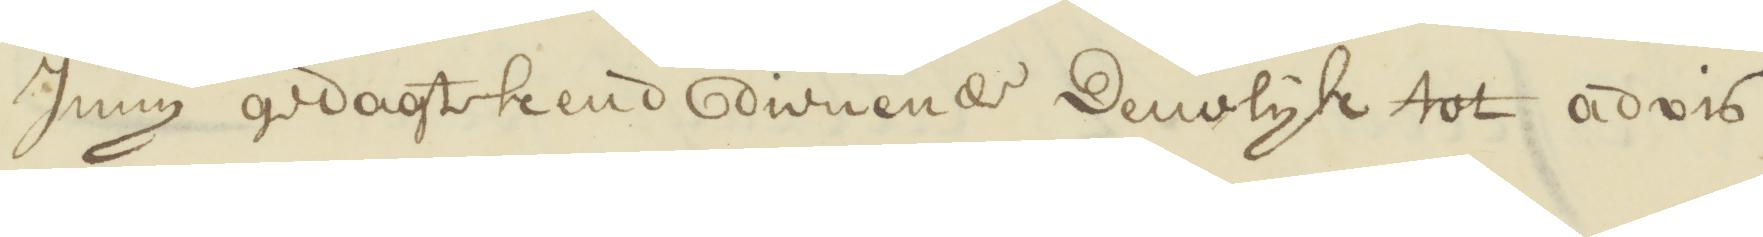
Junij gedagtekend dienende Eenelijk tot advis
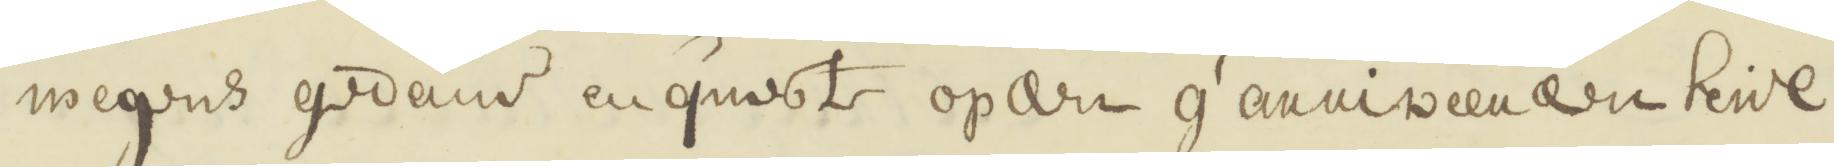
wegens gedane enqueste op den g’arriveerden kiel
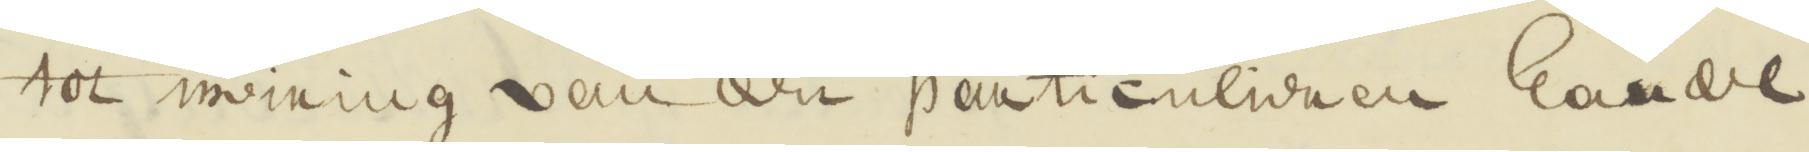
tot weiring van den particulieren handel
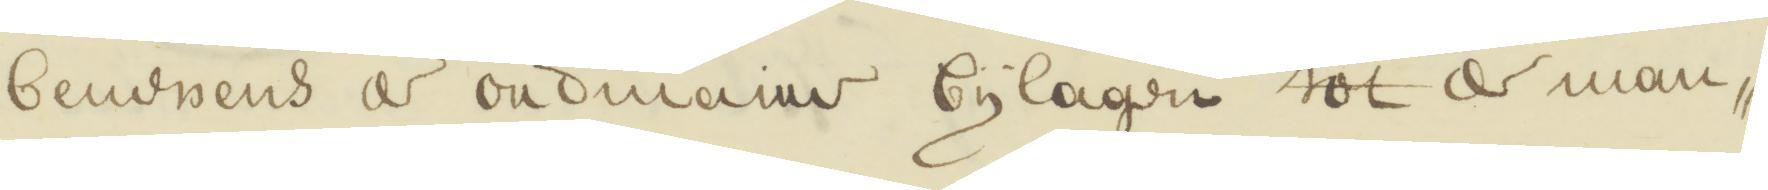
benevens de ordinaire bijlagen tot de man„
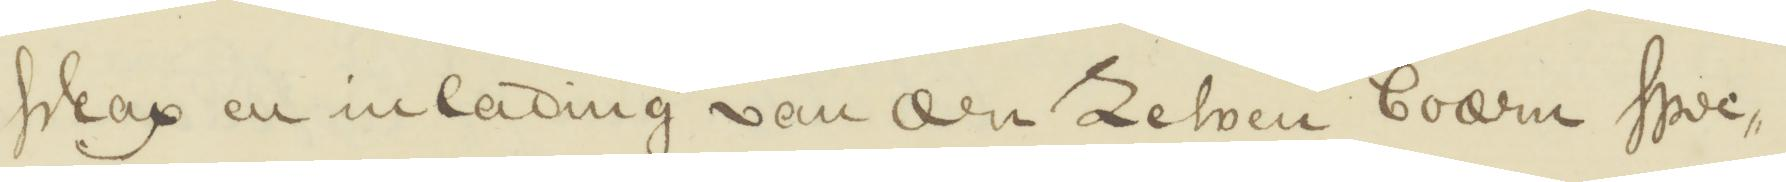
schap en inlading van den zelven bodem spec„
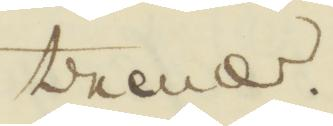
terende.
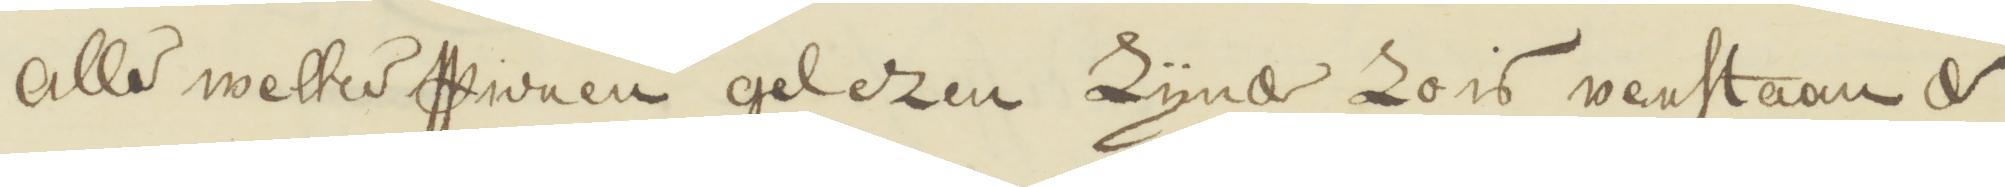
alle welke ppieren gelezen zijnde zo is verstaan de
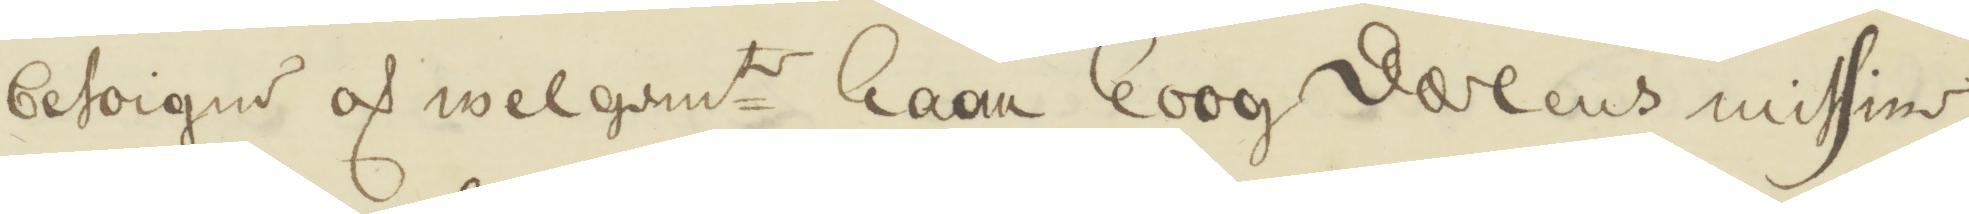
besoigne over wel gem=te haar hoog Edelens missive
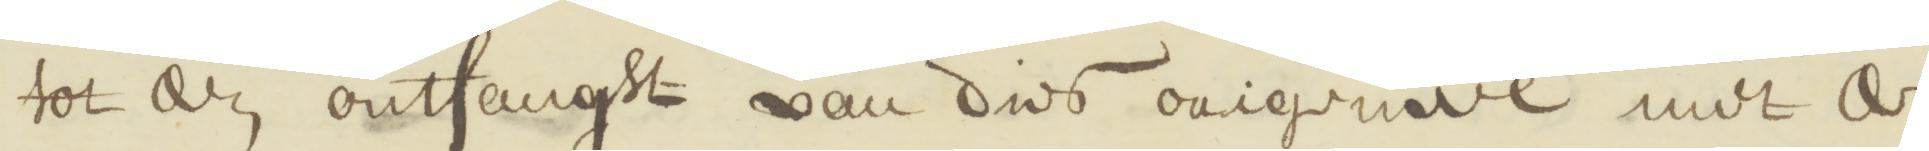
tot den ontfangst van dies origeneel met de
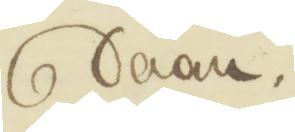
daar.
